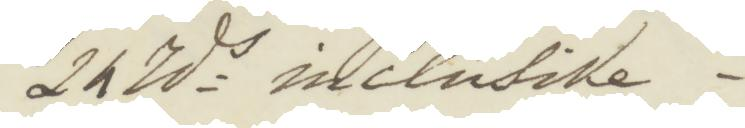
24 rd=s inclusive - - - - = =„ =
